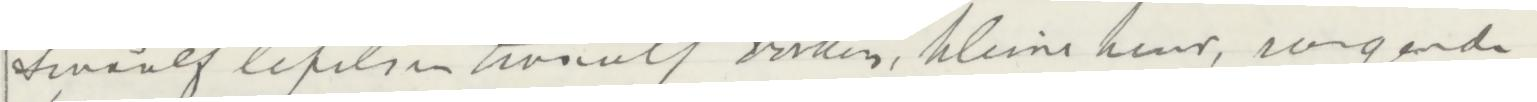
twaalf lepels en twaalf vorken, kleine keur, wegende
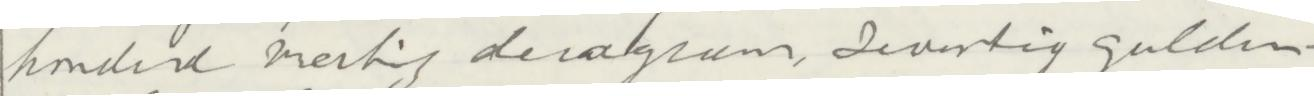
honderd veertig decagram, zeventig gulden
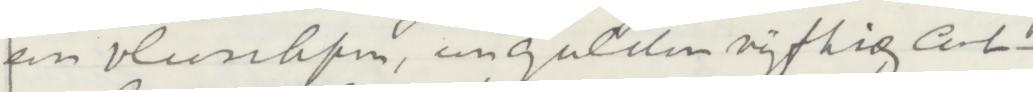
een vleeschpen, een gulden vijftig Cent
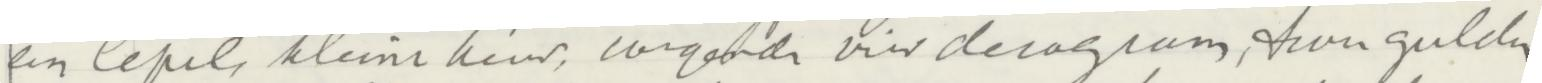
een lepel, kleine keur, wegende vier decagram, twee gulden
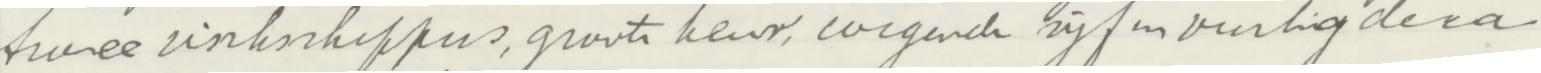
twee vischscheppers, groote keur, wegende vijf en veertig deca-
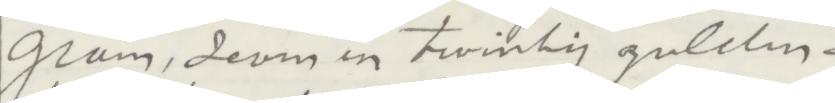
gram, zeven en twintig gulden
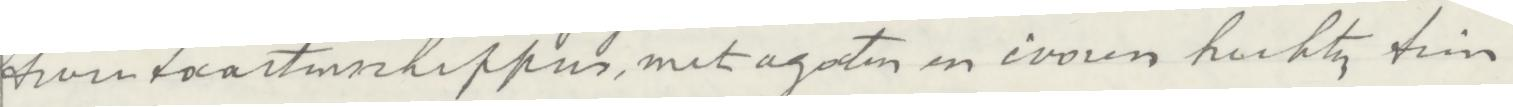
twee taartscheppers, met met agaten en ivoren heften, tien
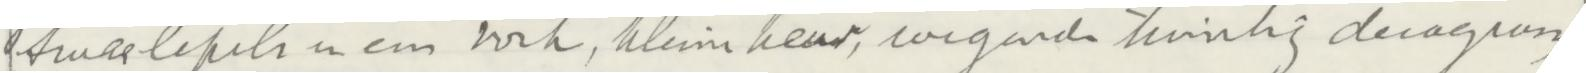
twee lepels in een vork, kleine keur, wegende twintig decagram
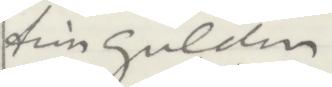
tien gulden
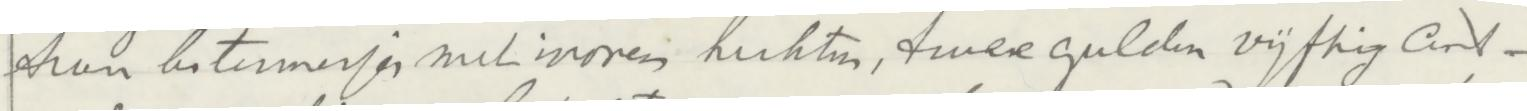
tien botermesjes met ivoren heften, twee gulden vijftig Cent
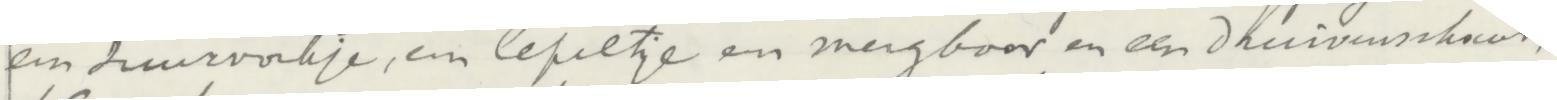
een zuurvorkje, een lepeltje een mergboor en een druivenschaar,
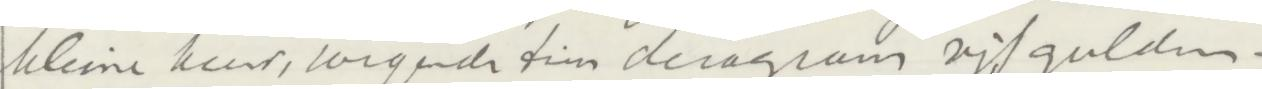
kleine keur, wegende tien decagram vijf gulden
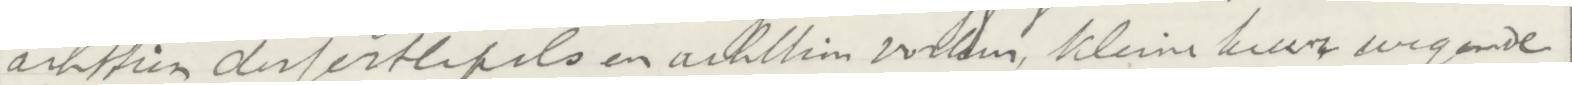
achttien dessertlepels en achttien vorken, kleine keur wegende
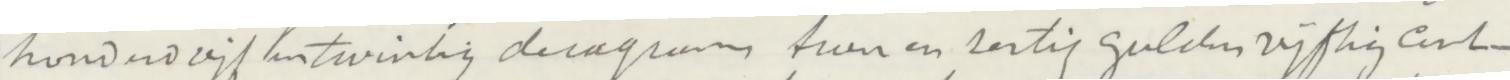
honderd vijf en twintig decagram twee en zestig gulden vijfitg cent
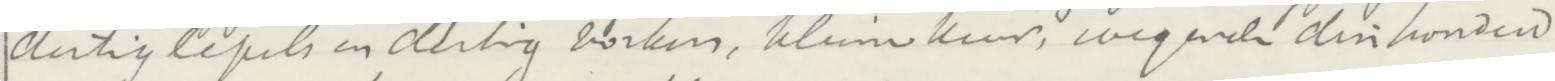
dertig lepels en dertig vorken, kleine keur, wegende drie honderd
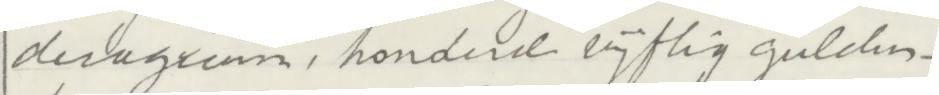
decagram, honderd vijftig gulden
